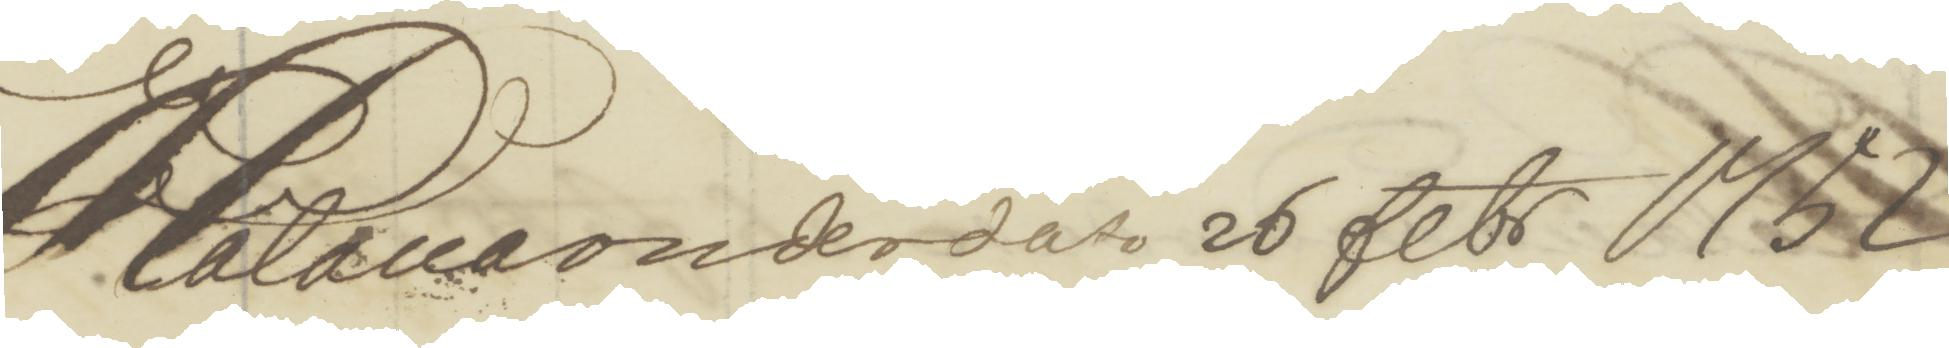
Malacca onder dato 26 febr 1752
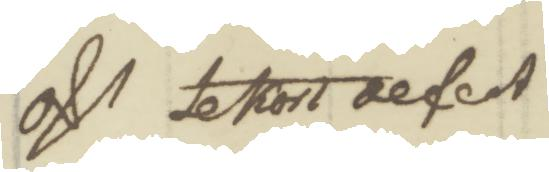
over tekort defect
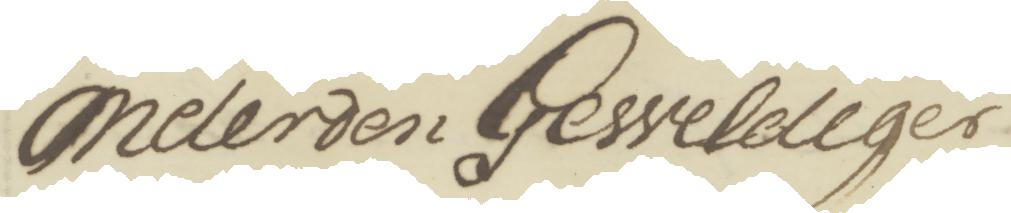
onder den Geweldeger
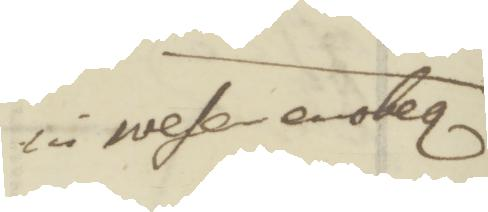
in wese en onbeq
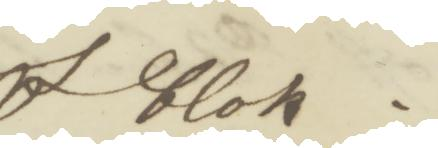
ps blok
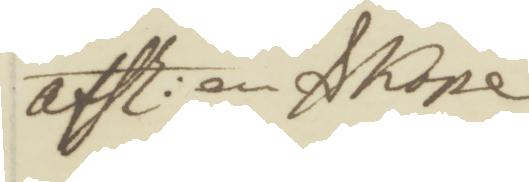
affh: en verkope
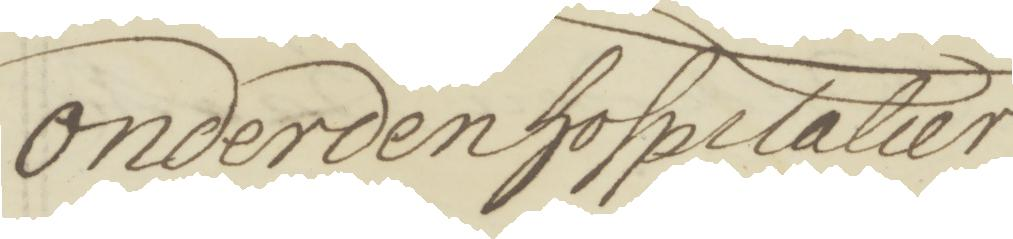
onder den Hospetalier
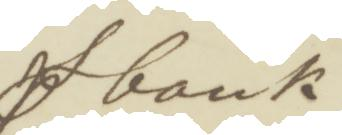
ps bank
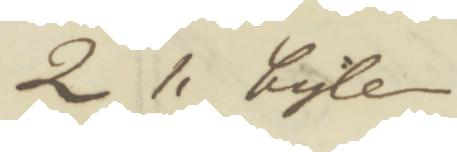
2 „ bijle
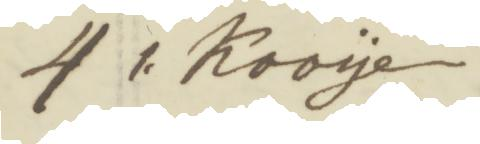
4 „ Kooije
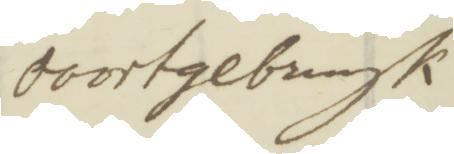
door t gebruyk
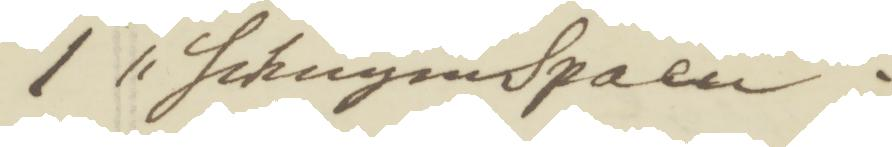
1 „ schuijmspaen
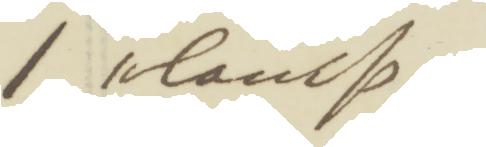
1 „ lamp
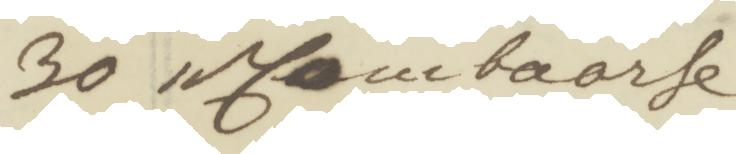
30 „ Courbaarse
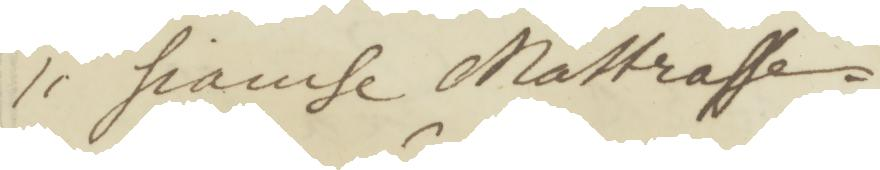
„ siamse Mattrasse -
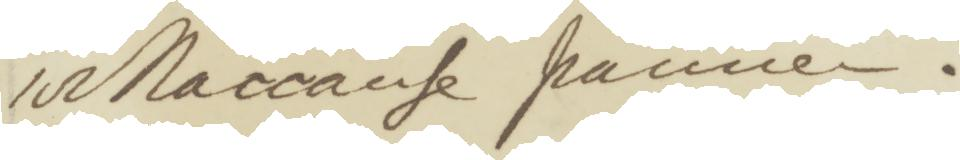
Maccause pannen.
